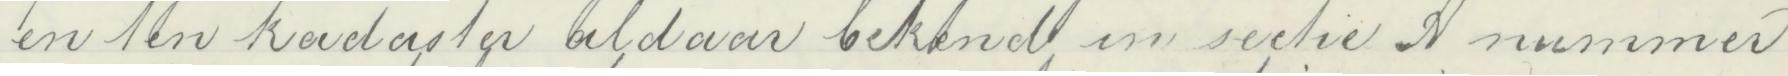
en ten kadaster aldaar bekend in sectie A nummer
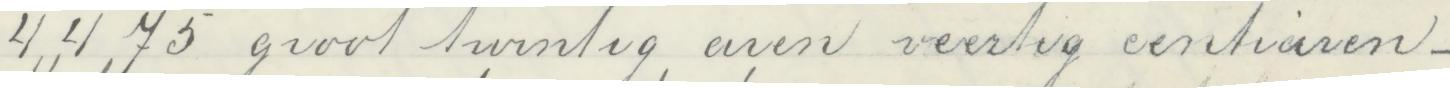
4475 groot twintig aren veertig centiaren
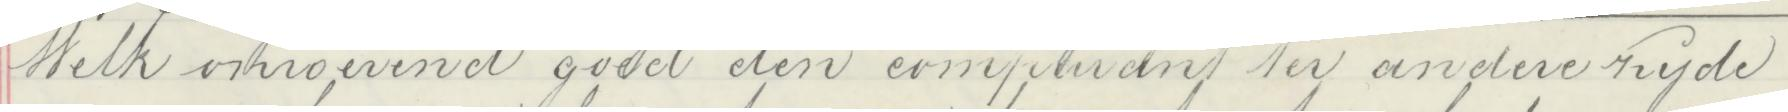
Welk onroerend goed den comparant ter andere zijde
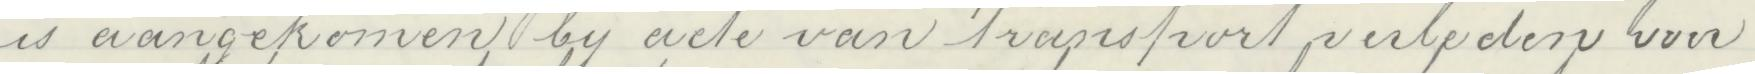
is aangekomen by acte van transport verleden voor
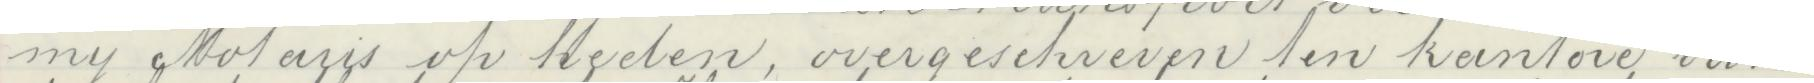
my Notaris op heden, overgeschreven ten kantore van
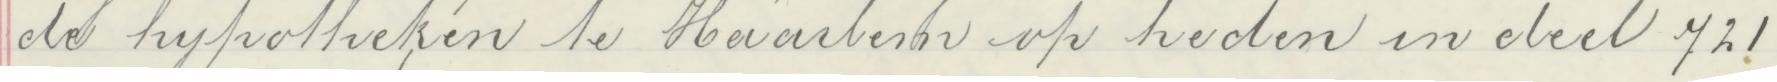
de hypotheken te Haarlem op heden in deel 721
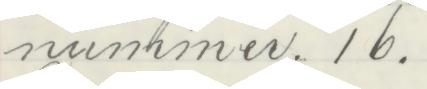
nummer. 16.
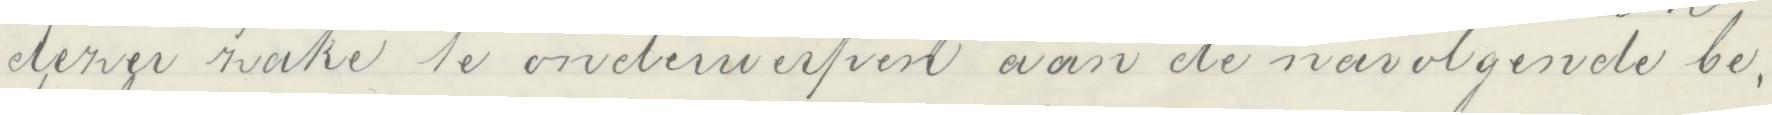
dezer zake te onderwerpen aan de navolgende be
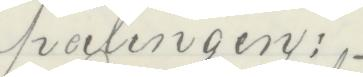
palingen:
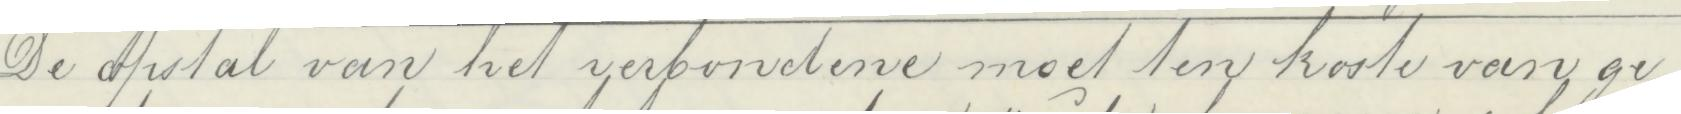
De opstal van het verbondene moet ten koste van ge
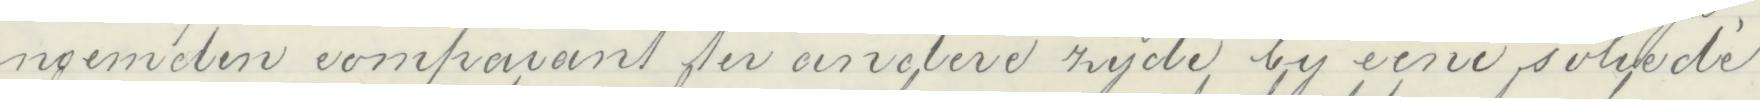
noemden comparant ter andere zijde by eene soliede
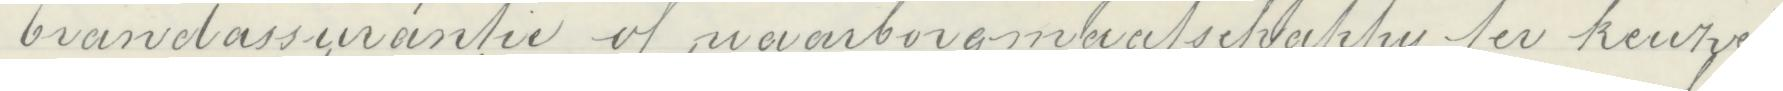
brandassurantie of waarborgmaatschappy ter keuze
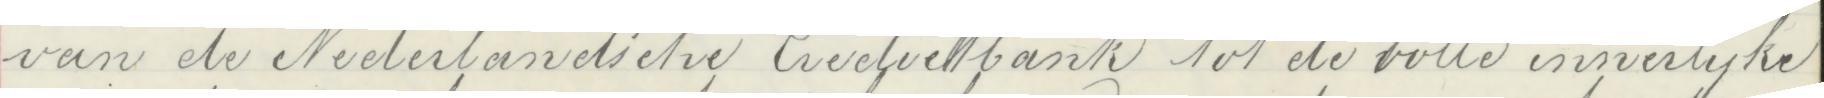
van de Nederlandsche Credietbank tot de volle innerlyke
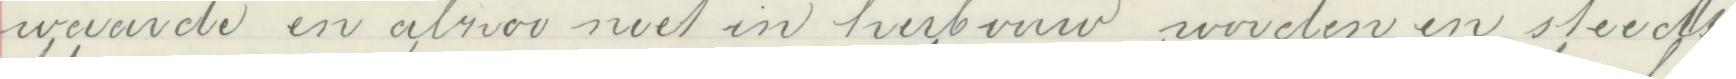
waarde en alzoo niet in herbouw worden en steeds
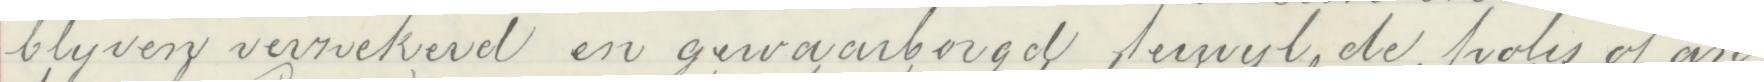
blyven verzoekerd en gewaarborgd terwyl de polis of an
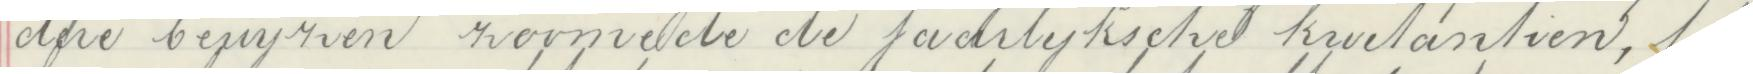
die bewyzen zoomede de jaarlyksche kwitantien, tel
